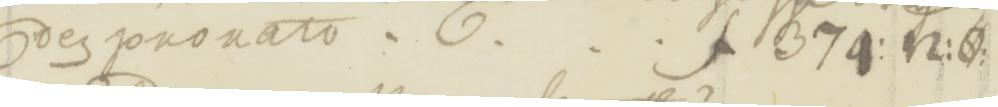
den prorato . . . . ƒ 374: 12: 8:
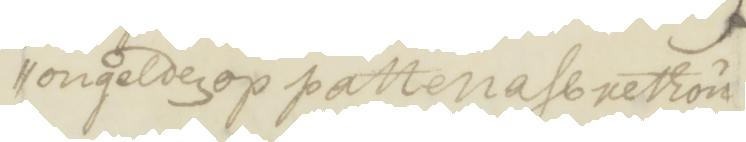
„ongelden op pattenas rethou
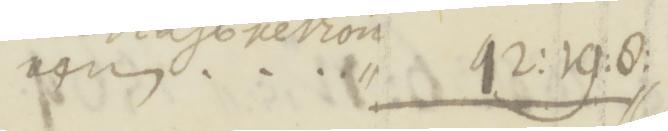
ren . . . .„ 42: 19: 8:
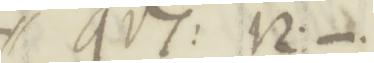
„ 417: 12: —.
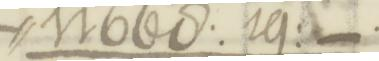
„ 11668: 19: —.
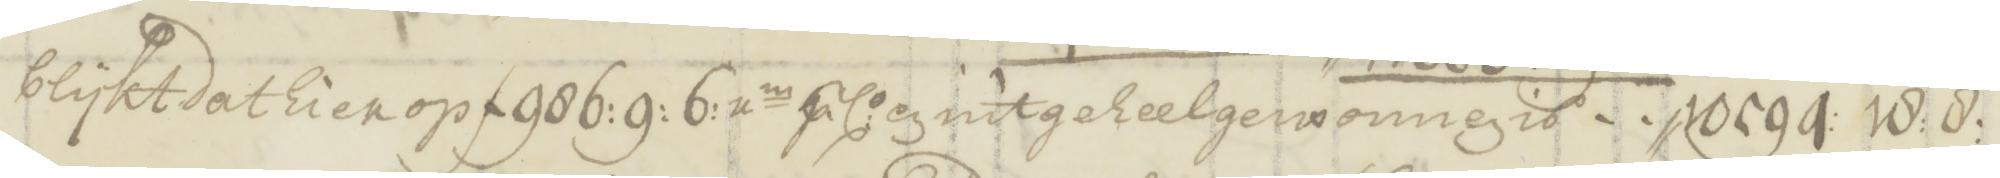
blijkt dat hier op ƒ 986: 9: 6: r=m p:rC:o en in't geheel gewonnen is . . „ 10594: 18: 8:
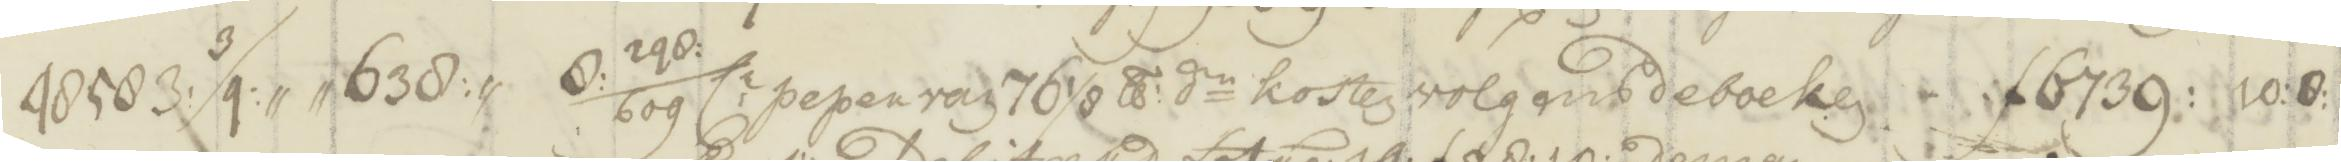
48583: ¾: „ „ 638: „ 8: 298/609: C„r peper van 76 1/8 lb: d=n kosten volgens de boeken . . ƒ 6739: 10: 8:
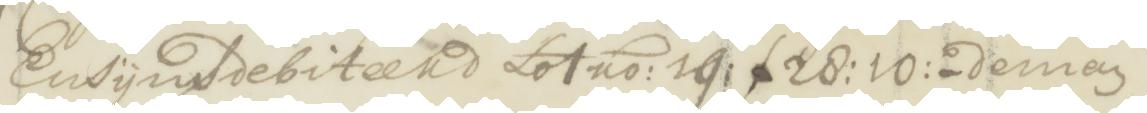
En sijnverdebiteerd tot ro: 19: ƒ28: 10: - deman
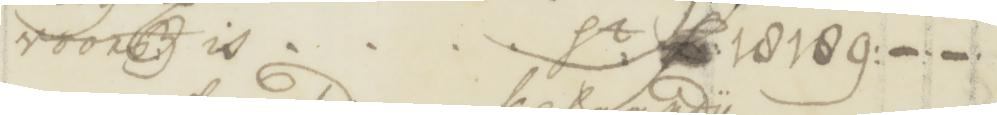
voorsz: is . . . . s:t ƒ 18189: —: —.
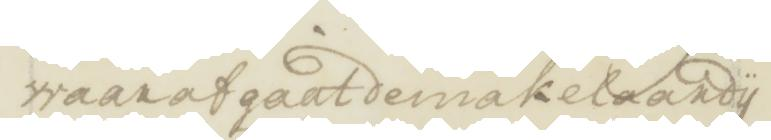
waar af gaat de makelaardij
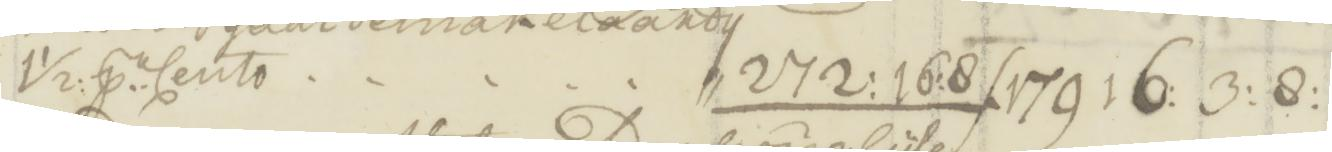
1½: p..r Cento . - - . . „ 272: 16: 8 ƒ17916: 3: 8:
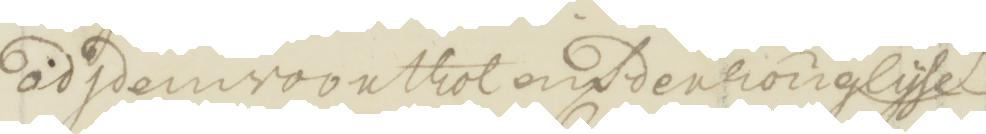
ad jdem voor thol en verderhouglijse
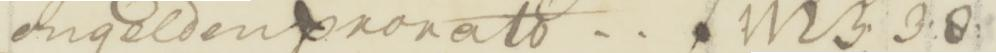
ongelden prorato - . ƒ1123: 3: 8:
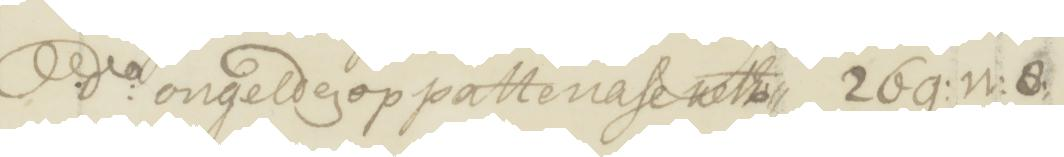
.d:o ongelden op pattenase reth„ 269: 11: 8:
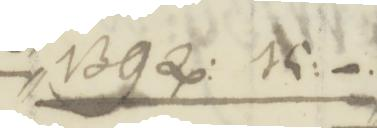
„ 1392: 15: —.
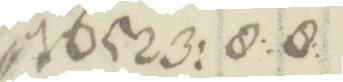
„ 16523: 8: 8:
